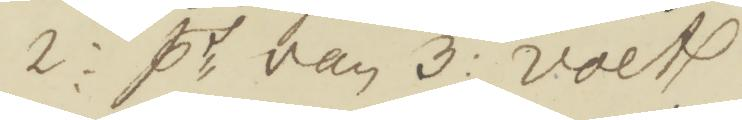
2: p„s van 3: voet
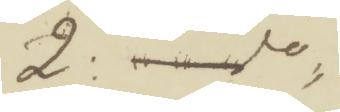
2: _„o
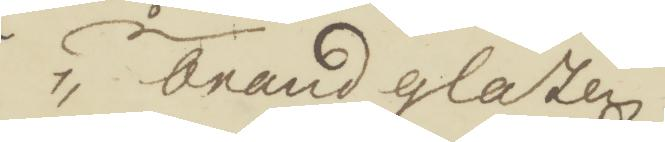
5 „ brand glazen
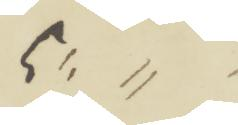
5: „
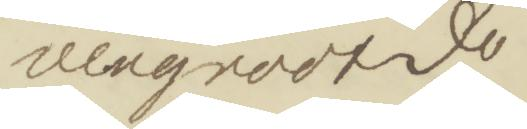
vergroot d„o
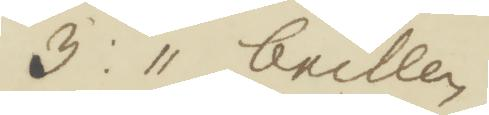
3: „ brillen
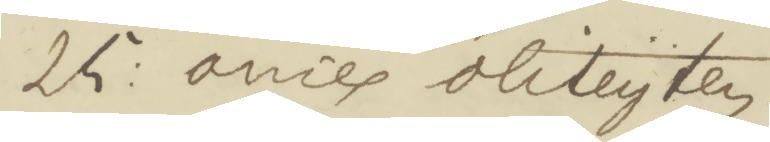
25: once oliteijten
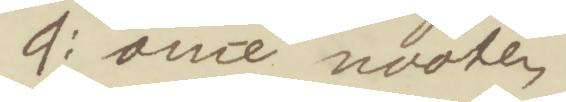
4: once nooten
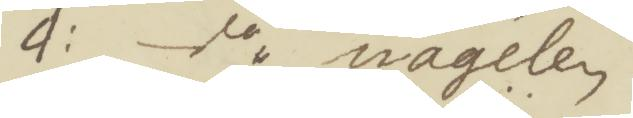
4: _„o nagelen
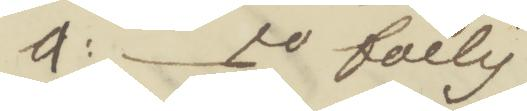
4: _o foelij
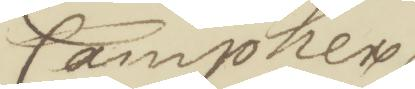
Campher
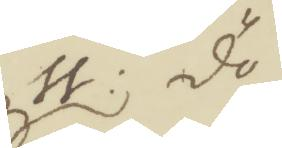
11: d„o
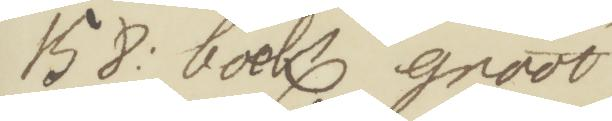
158: boek groot
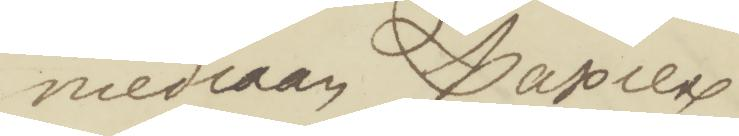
mediaan papier
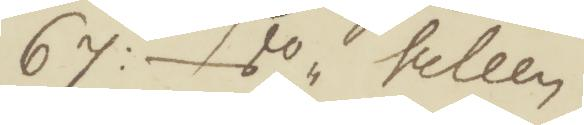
67: _„o kleen
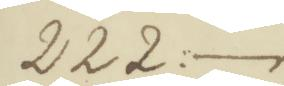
222: —„o
